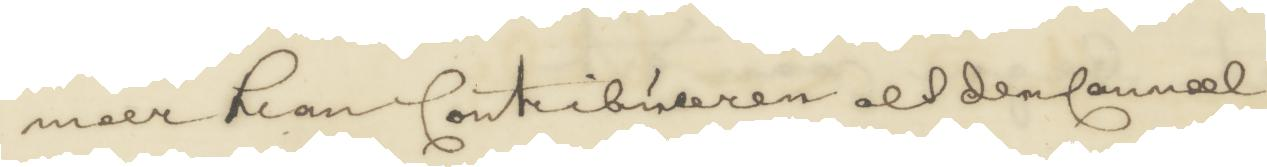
meer kan contribueeren als den Canneel
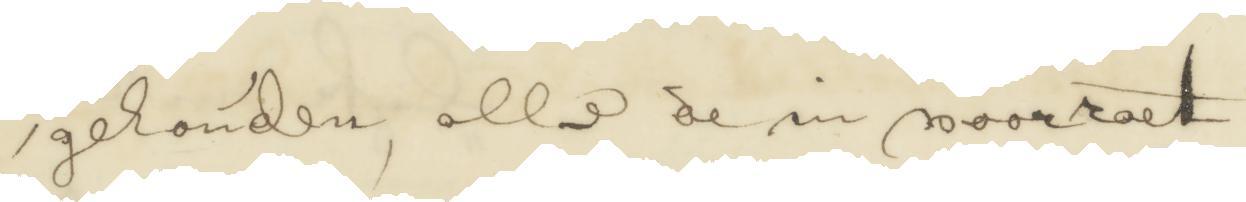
gehouden, alle de in voorraet
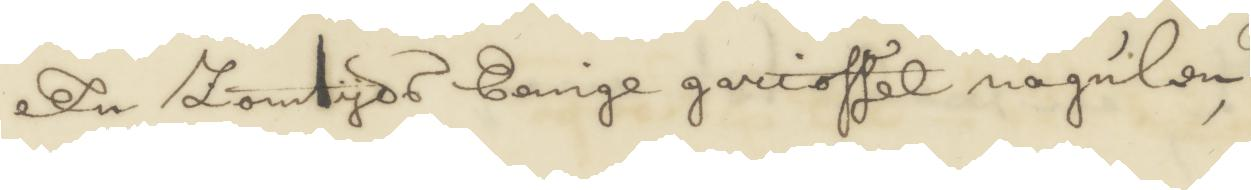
En Zomtijds Eenige garioffel nagulen
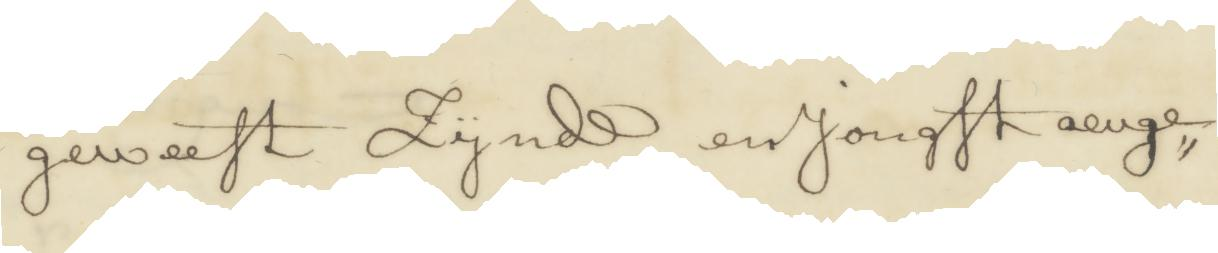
geweest Zijnde en Jongst aenge„
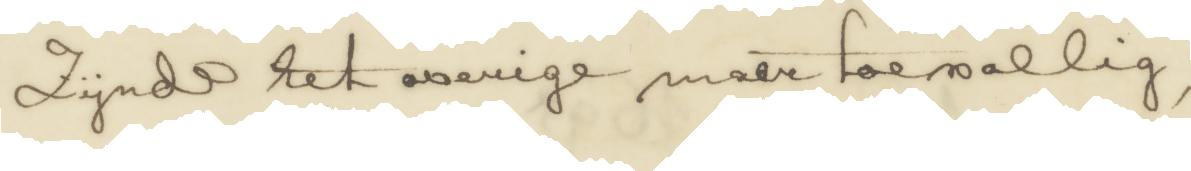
Zijnde het overige maer toevallig,
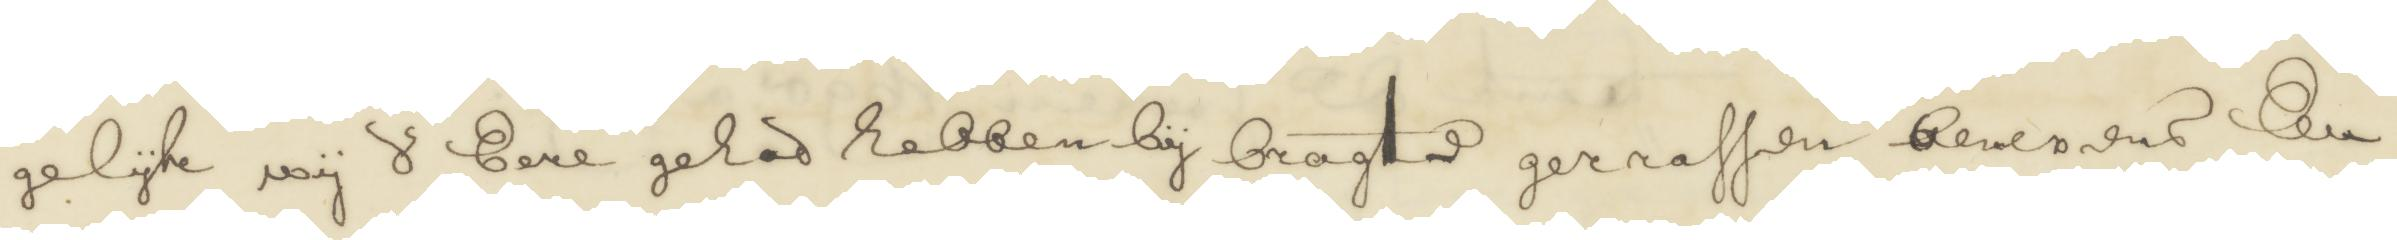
gelijk wij d’ Eere gehad hebben bij „bragte gerrassen benevens Een
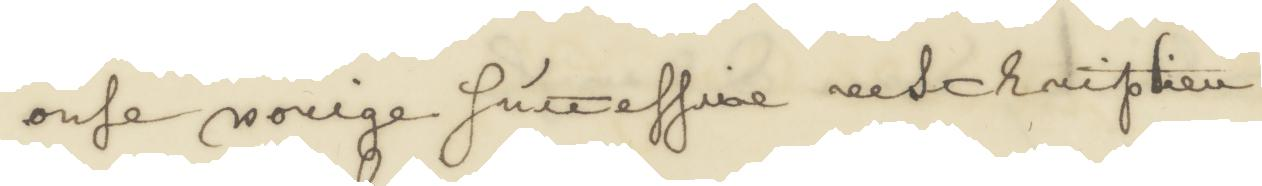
onse vorige successive reschriptien
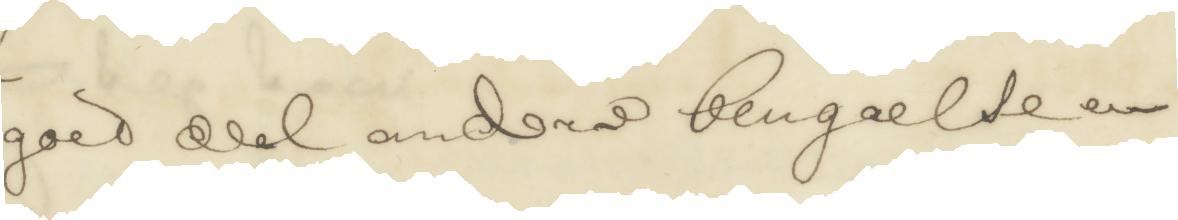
goed deel andere bengaelse en
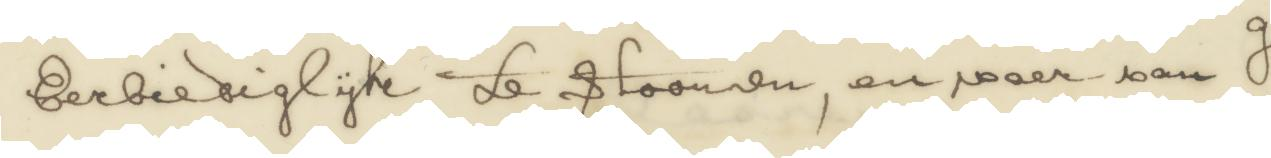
Eerbiediglijk te vertoonen, en waer van
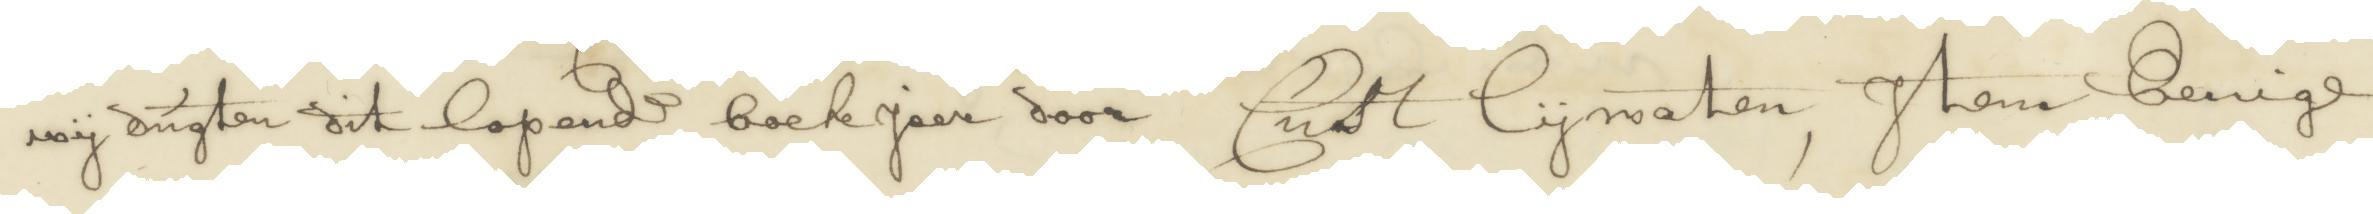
wij dugten dit lopende boekjaer door Cust lijwaten, Jtem Eenige
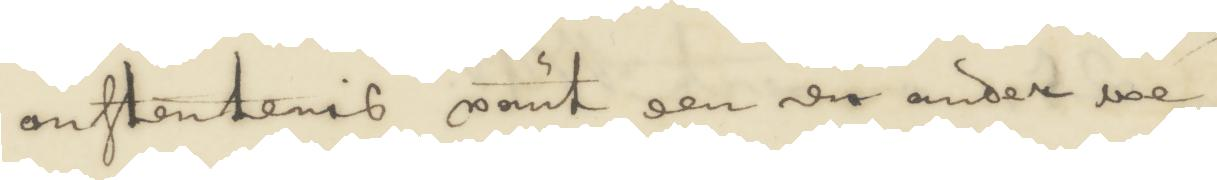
onstentenis van't een en ander we
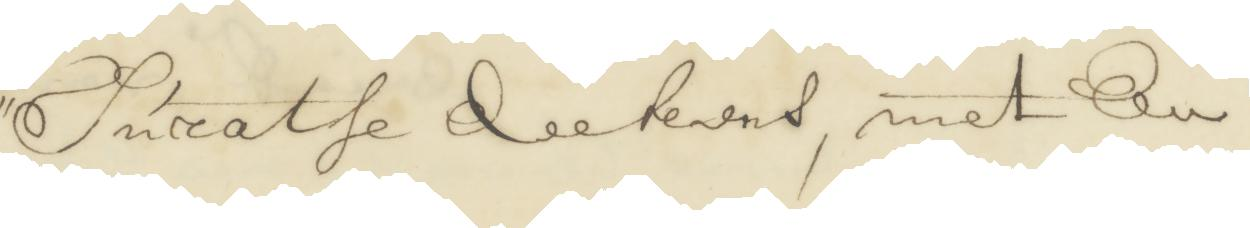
Suratse deekens, met Een
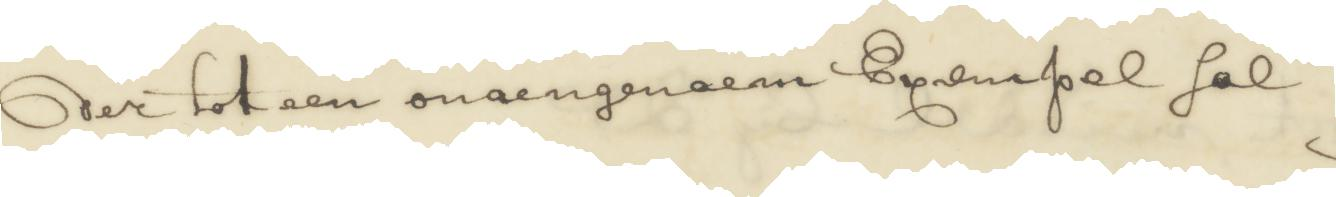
der tot een onaengenaem Exempel sal
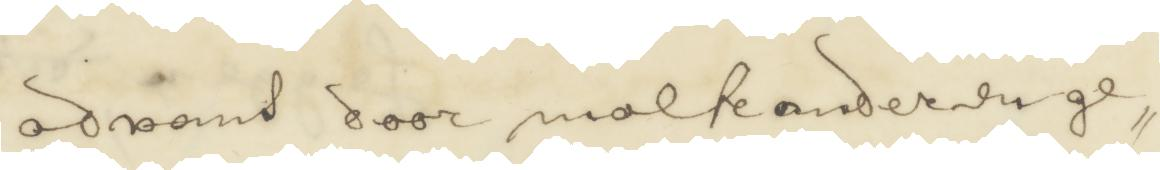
advans door malkanderen ge„
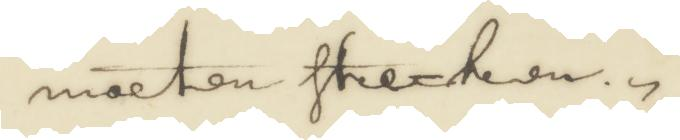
moeten strecken.
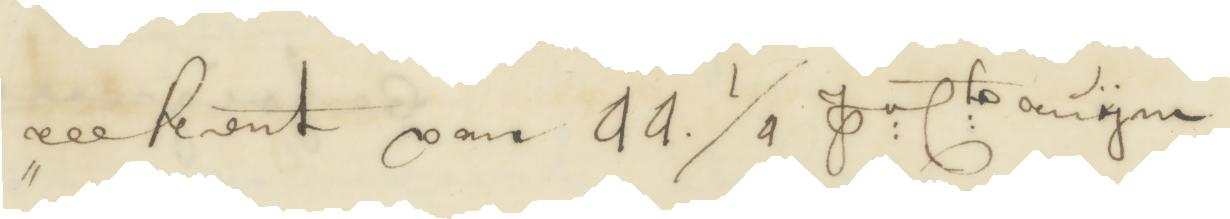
„reekent van 44.¼ p:r C:to ruijm,
